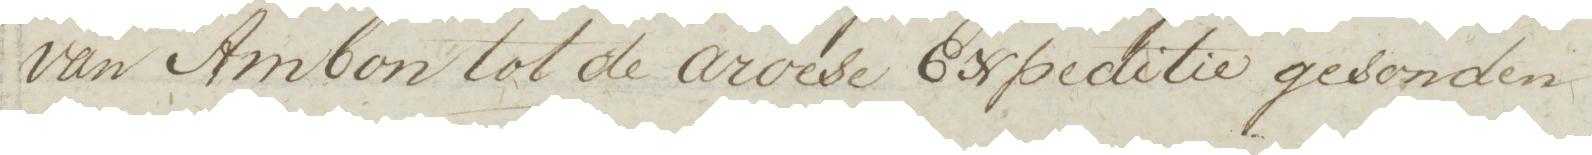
van Ambon tot de aroese Expeditie gesonden
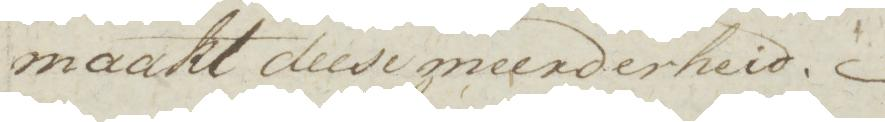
maakt deese meerderheid. —
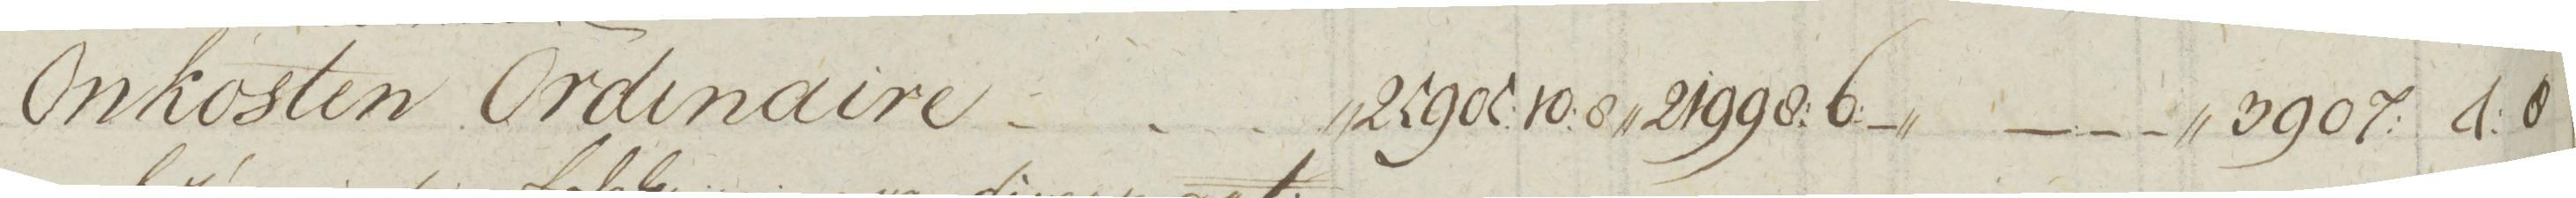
Onkosten Ordinaire - - - „25905:10:8 „ 21998: 6: —„ —: — - „ 3907: 4: 8
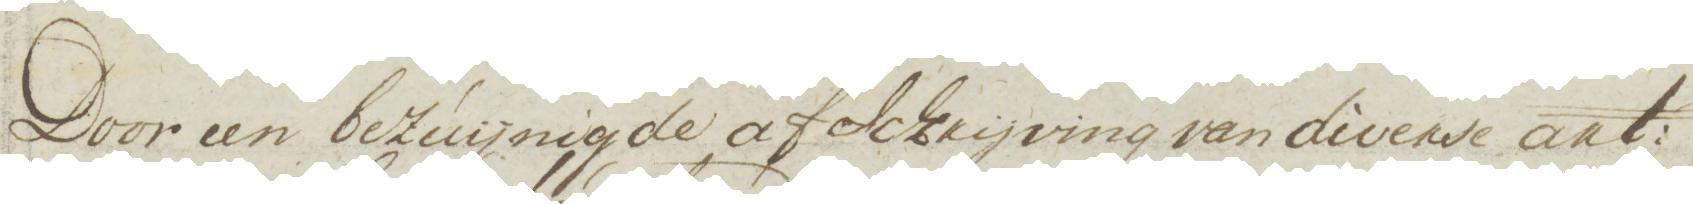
Door een bezuijnigde afschrijving van diverse art:
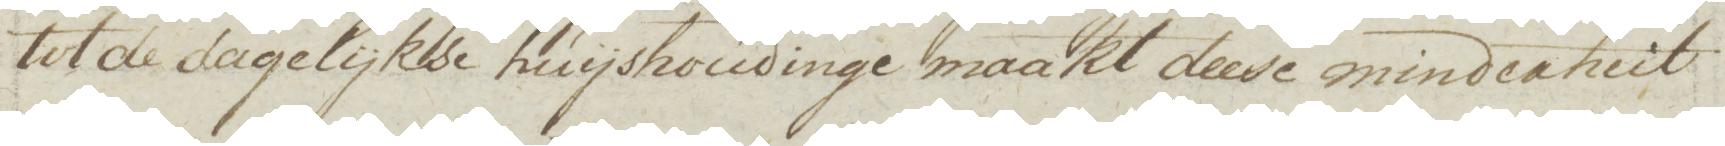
tot de dagelijkse huijshoudinge maakt deese minderheit
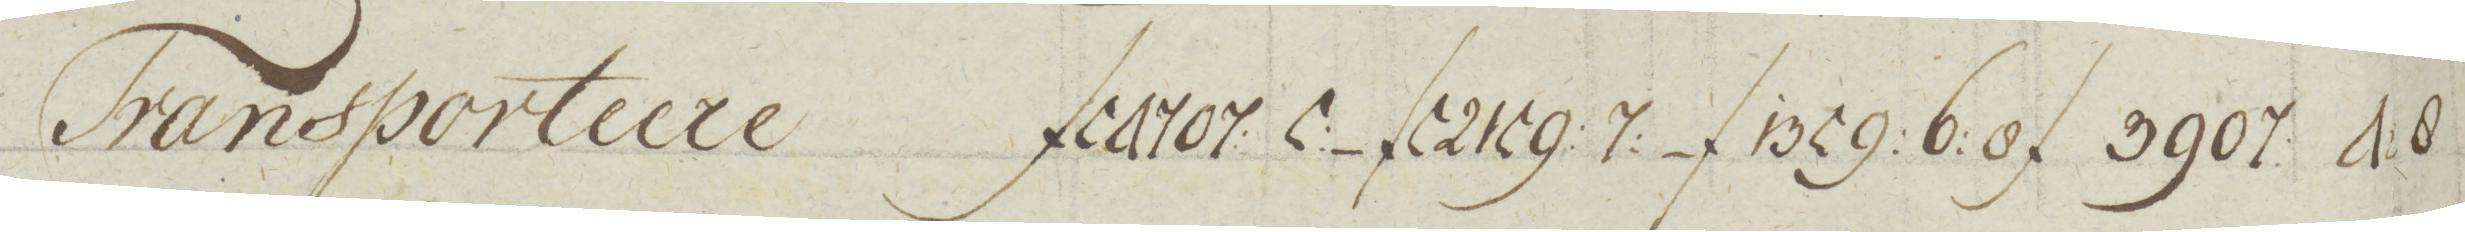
Transporteere ƒ54707: 5: — ƒ52159: 7: —ƒ 1359: 6: 8ƒ 3907: 4: 8
